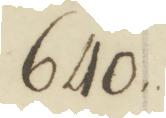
ƒ 640,.
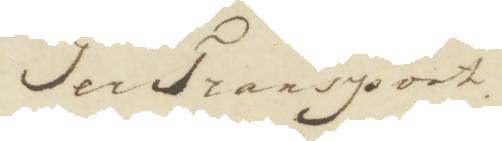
Per Transport,
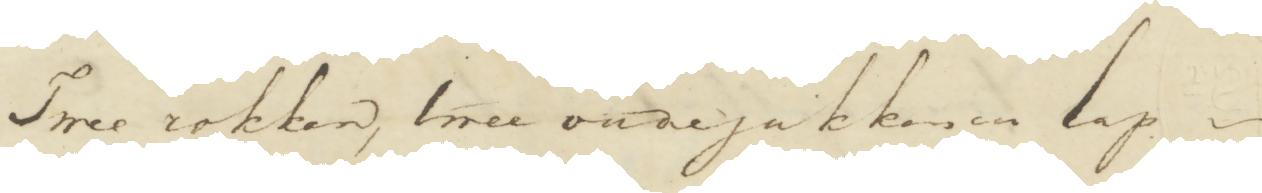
Twee rokken, twee oudejakken en lap
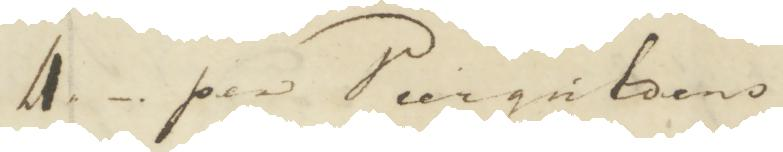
4: —. pen Vier guldens
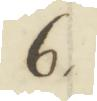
6,
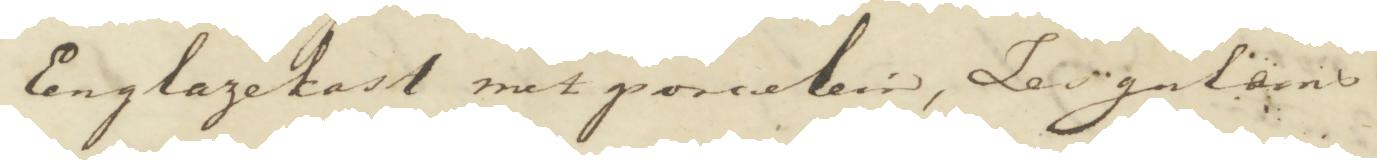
Een glaze kast met porcelein, Zes guldens
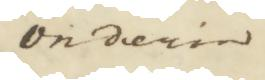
onderin
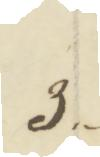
3,-
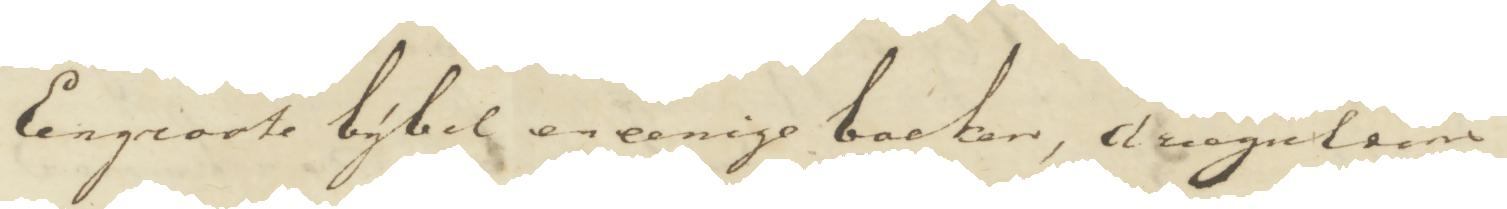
Een groote bijbel en eenige boeken, drieguldens
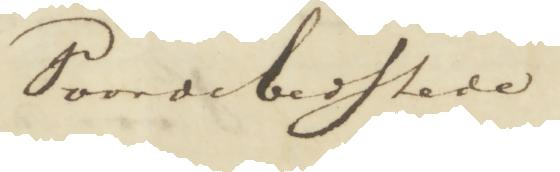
Voorde bedstede
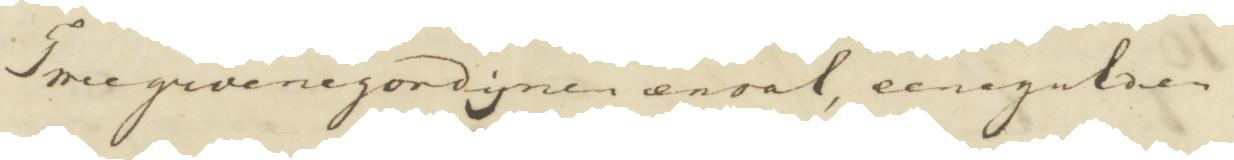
Twee groene gordijnen en val, eene gulden
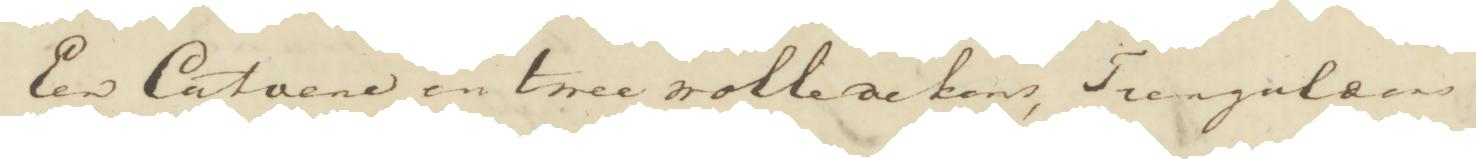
Een Catoene en twee wolle dekens, Tien guldens
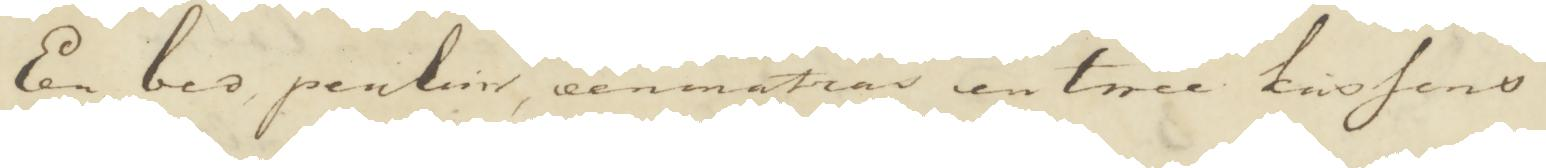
Een bed peuluw, een matras en twee kussens
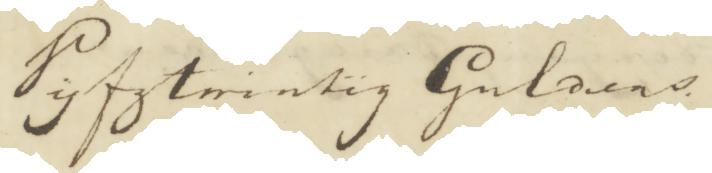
Vyfentwintig Guldens
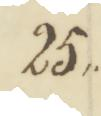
25,.
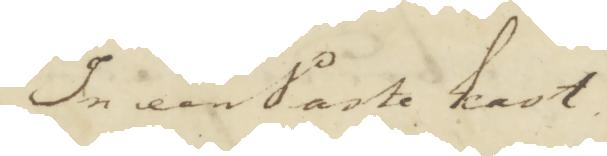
In een Vaste kast
